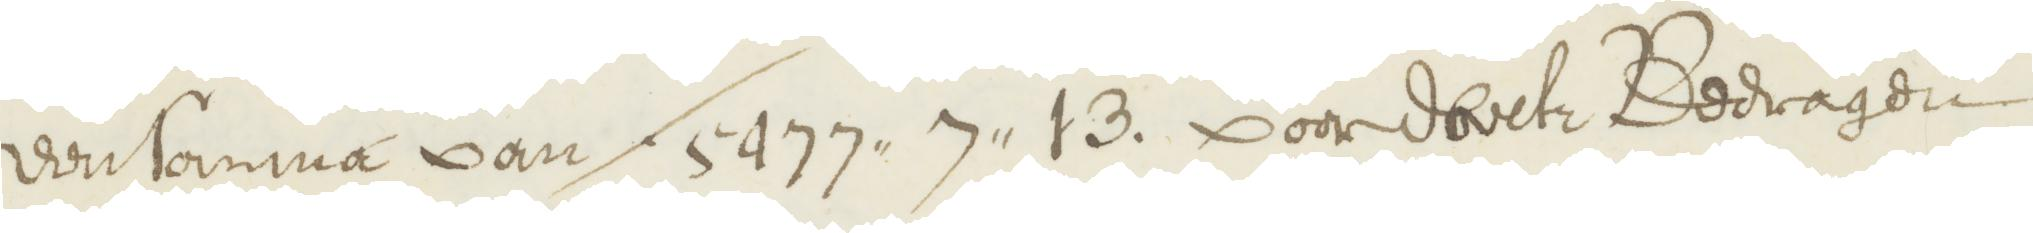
een Somma van ƒ 5477„ 7„ 13. voorwelk Bedragen
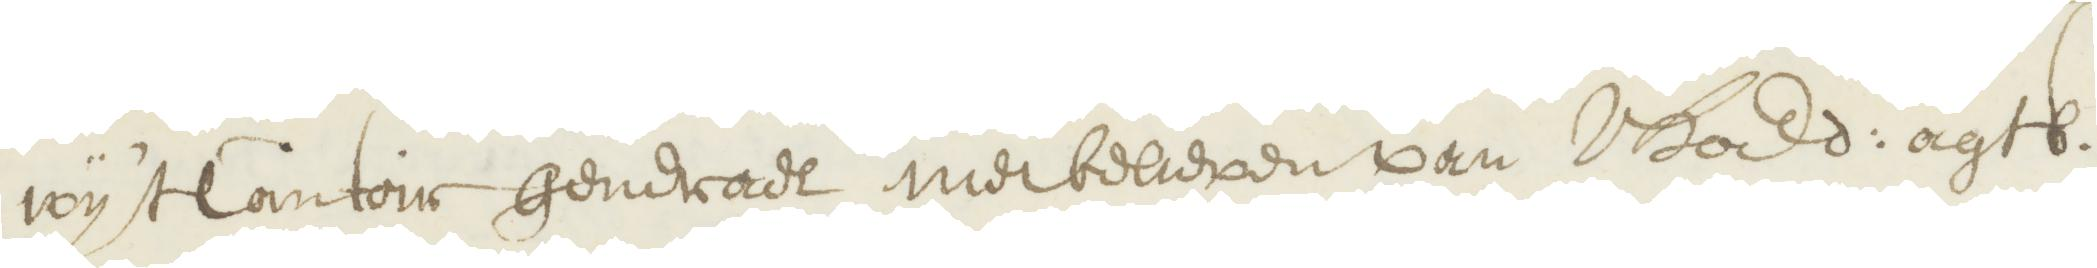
wij ’t Cantoir generael met believen van V HoEd: agtb.
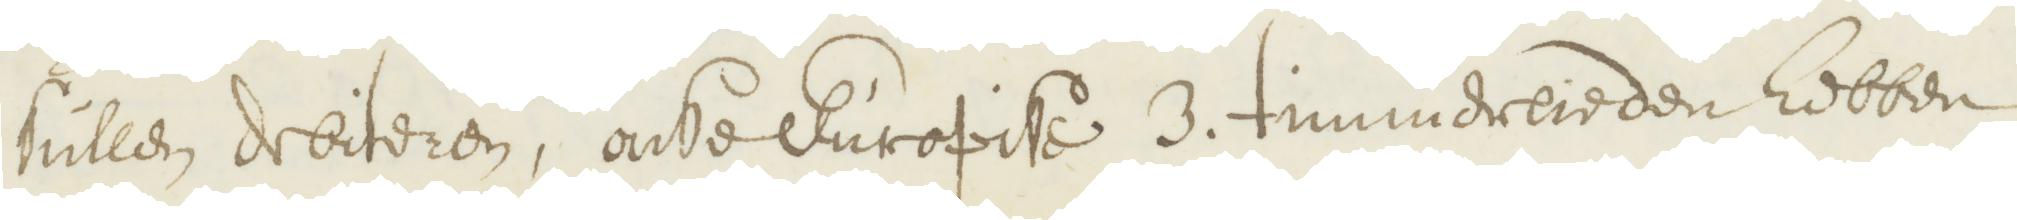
Sullen debiteren, onse Europise 3. timmerlieden hebben
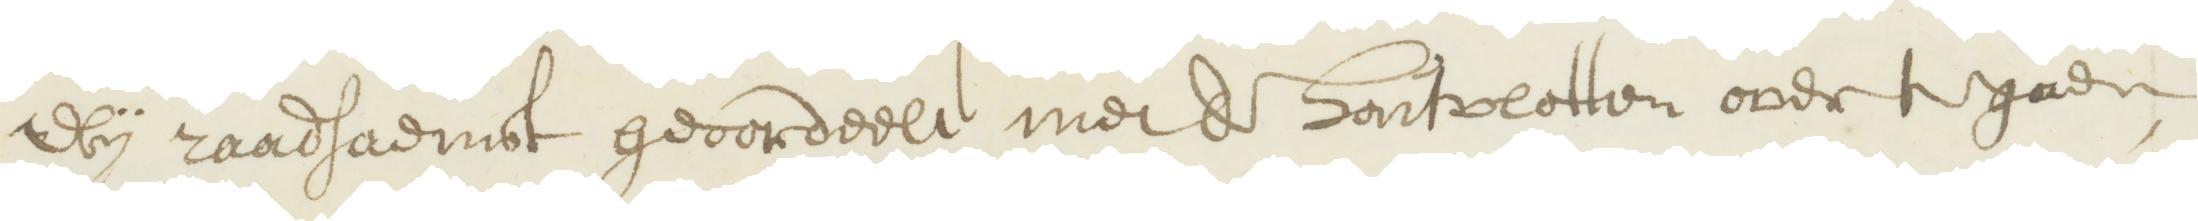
wij raadsaemst geoordeelt met de houtvlotten over te gaen
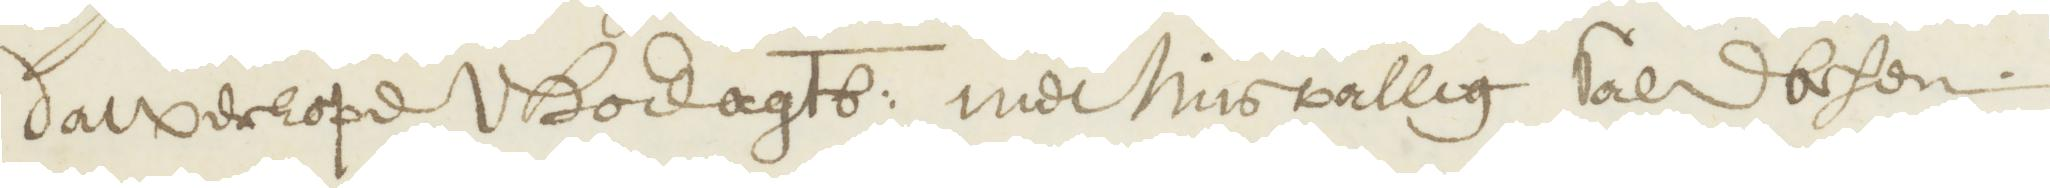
dat verhope VHoE agtb: niet Misvallig Sal wesen.
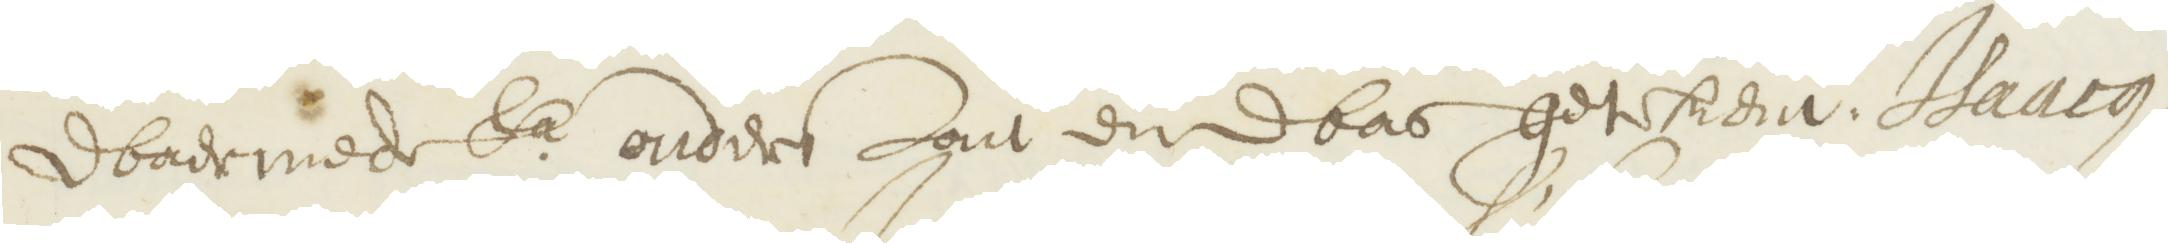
waermede &:a onderstont en was getekent. Isaacq
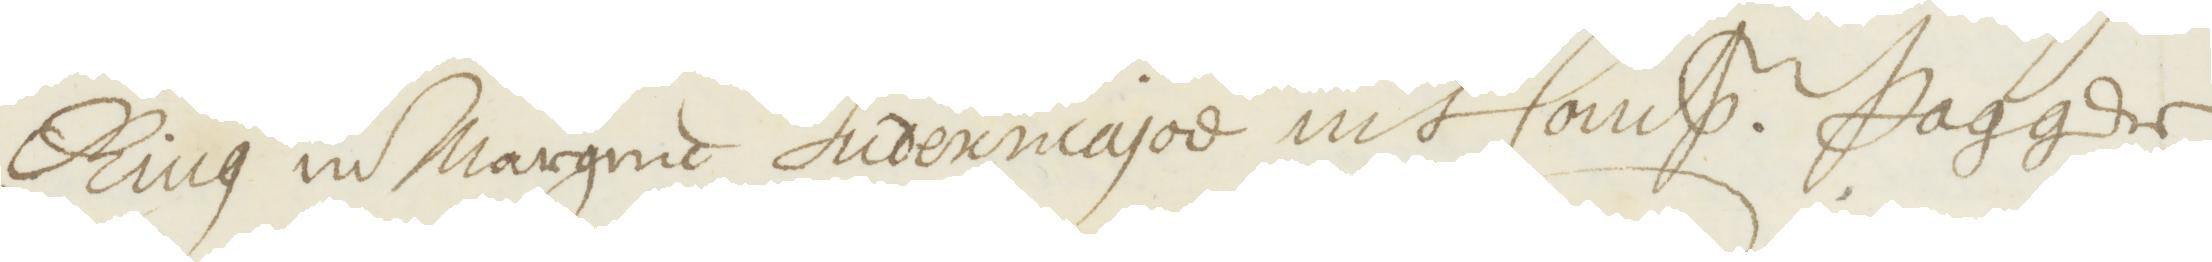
Ring in Margine Indermajoe in ’s Comp.e Pagger
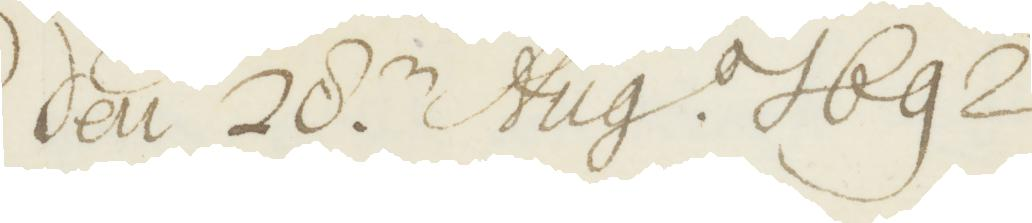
den 28:e Aug:o 1692
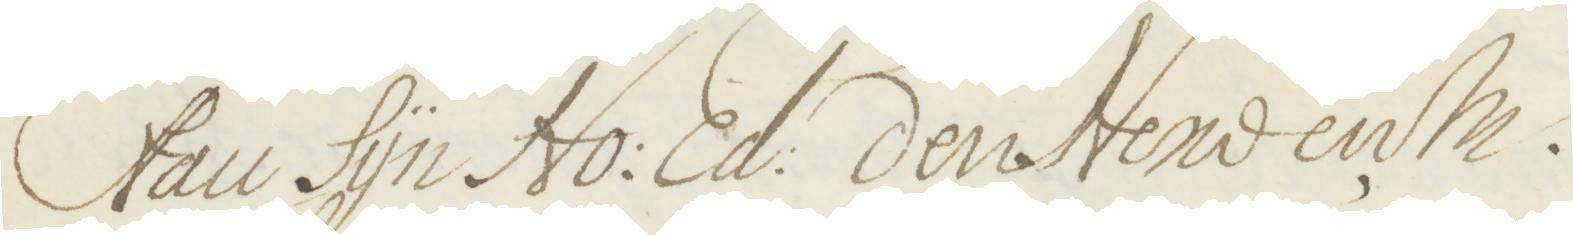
Aan Sijn Ho: Ed: den Here en M.r
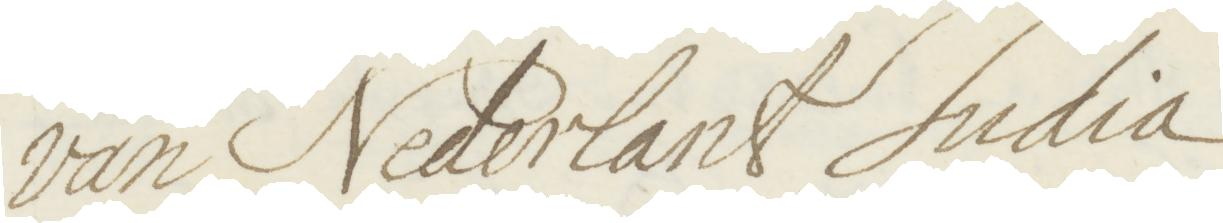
van Nederlant India
